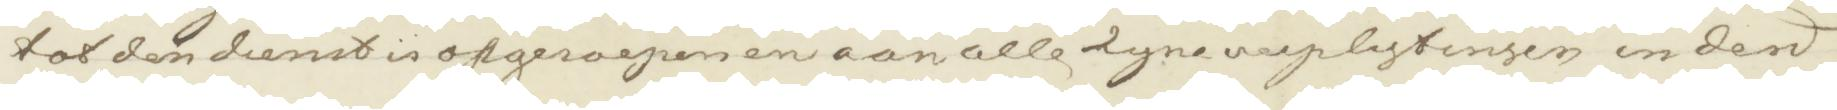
tot den dienst is opgeroepen en aan alle zijne verpligtingen in den
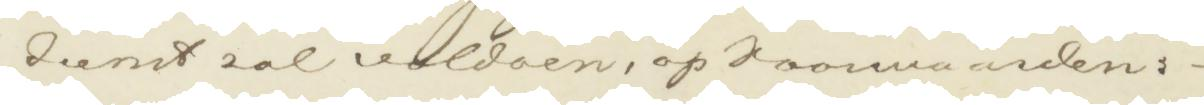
dienst zal voldoen, op voorwaarden:
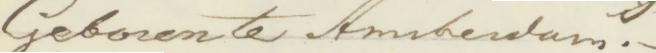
Geboren te Amsterdam.-
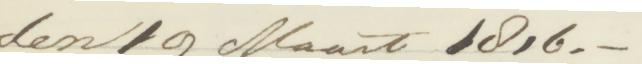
den 19 Maart 1816.-
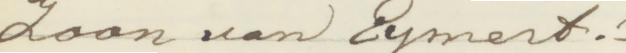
Zoon van Eymert.-
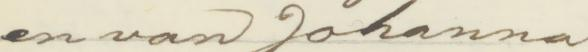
en van Johanna
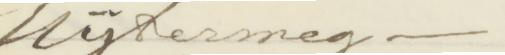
Uijterweg.
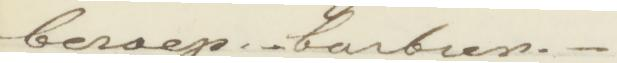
beroep,-barbier.-
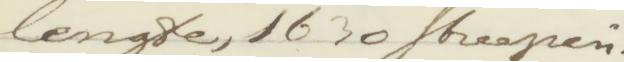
lengte, 1630 streepen
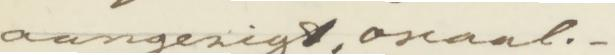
aangezigt, ovaal.-
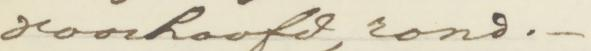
voorhoofd, rond.-
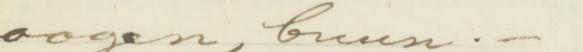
oogen, bruin.-
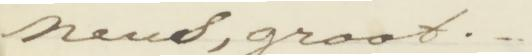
neus, groot.-
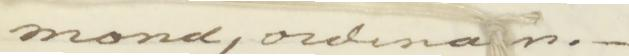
mond, ordinair.-
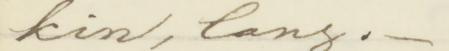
kin, lang.-
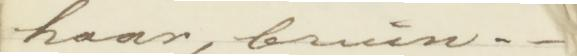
haar, bruin--
